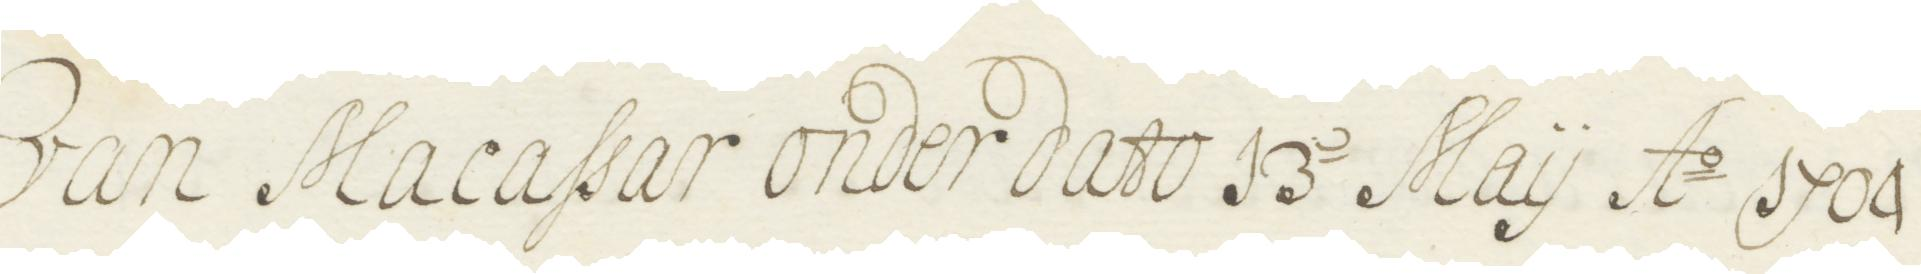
Van Macassar onder dato 13-' Maij A=o 1704
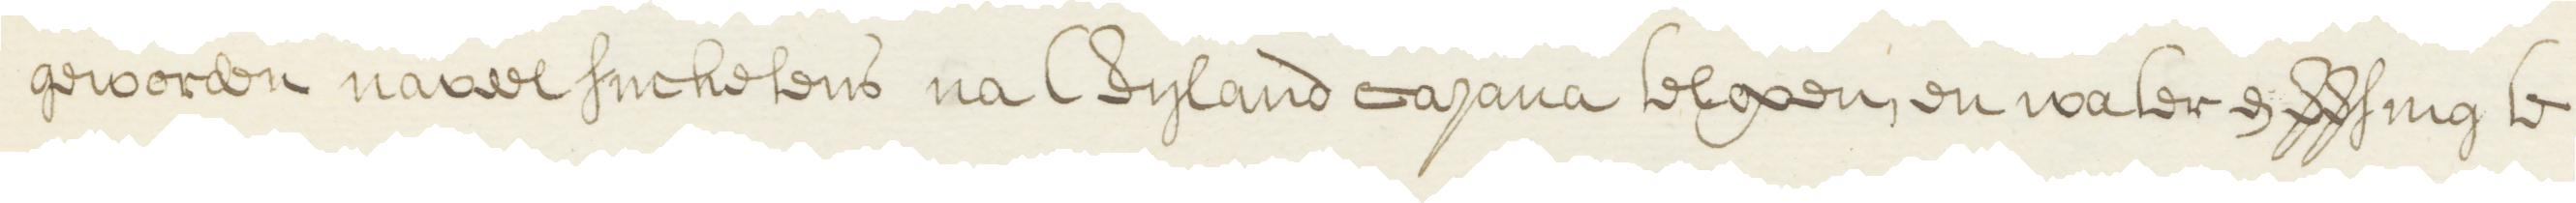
geworden naveel suckelens na t Eyland cajana telopen, en water en verversing te
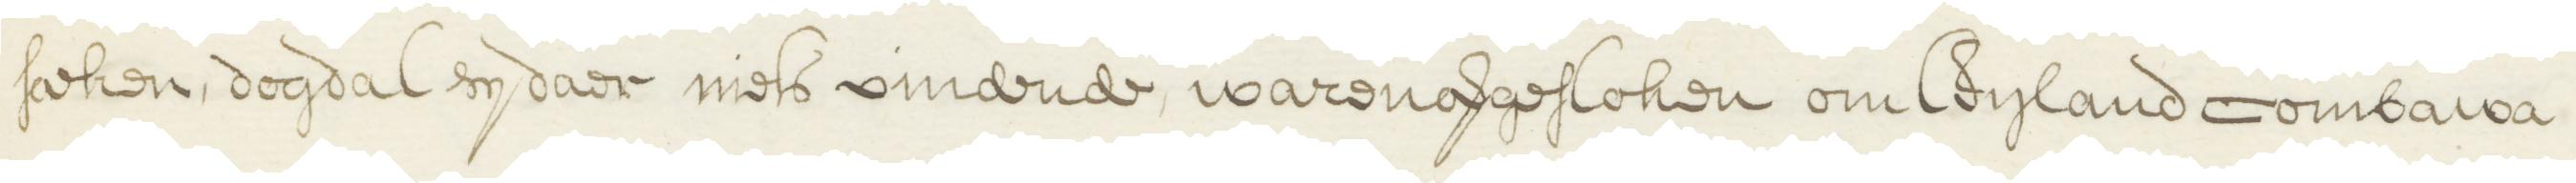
soeken, dogdat sy daer niets vindende, waren overgestoken om tEyland combawa
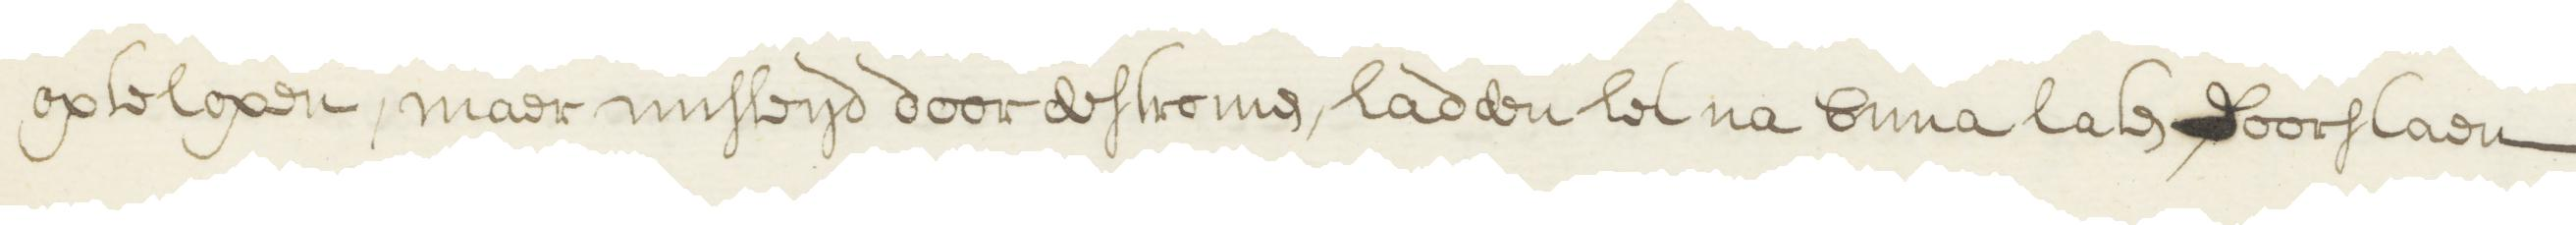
optelopen, maer misleyd door de stromen, hadden het na bima laten voorstaen
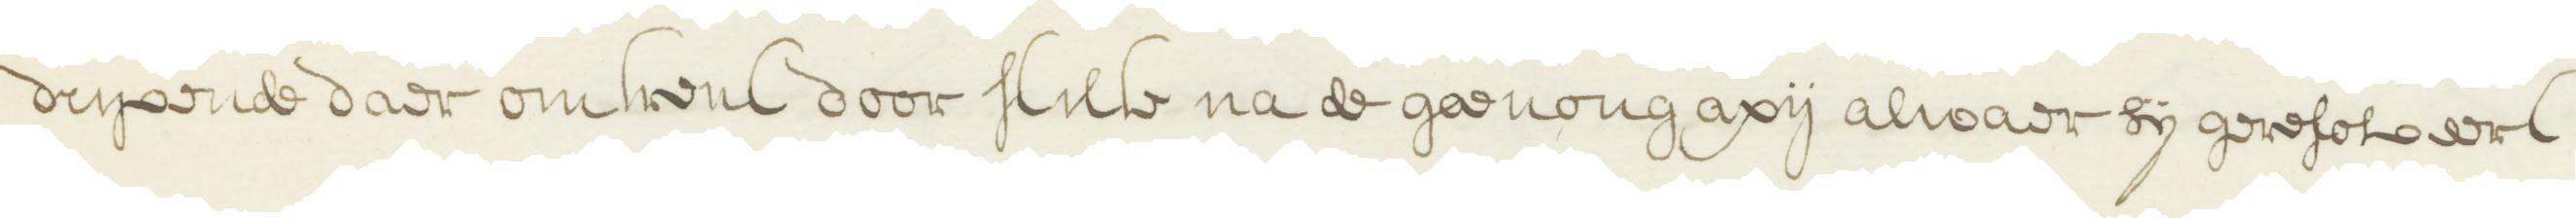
dryvende daer omtrent door stilte na de goenongapij alwaer sij geresolveert
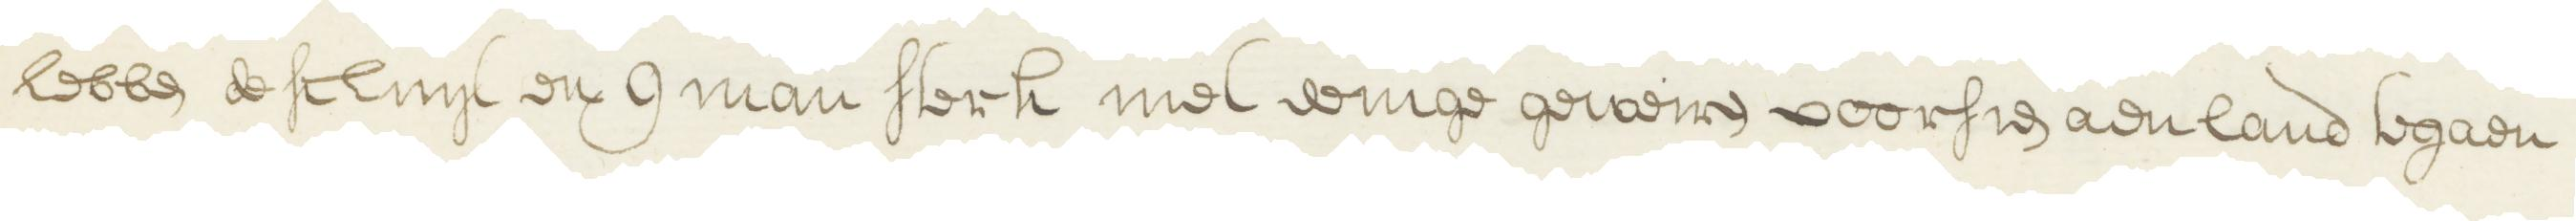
hebben de schuyt en 9 man sterk met eenige geweiren voorsien aen land tegaen
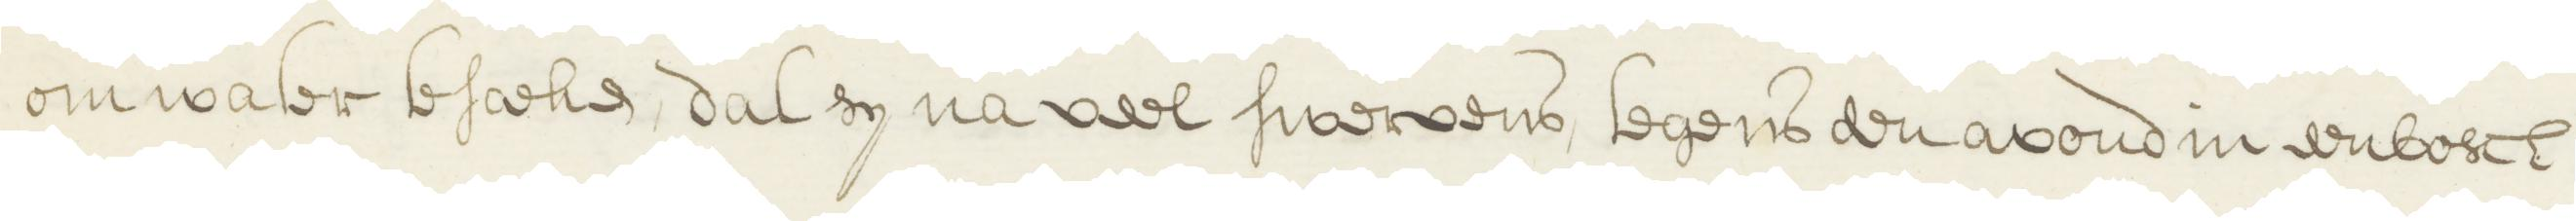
om water te soeken, dat sy na veel swervens, tegens den avond in een bosch
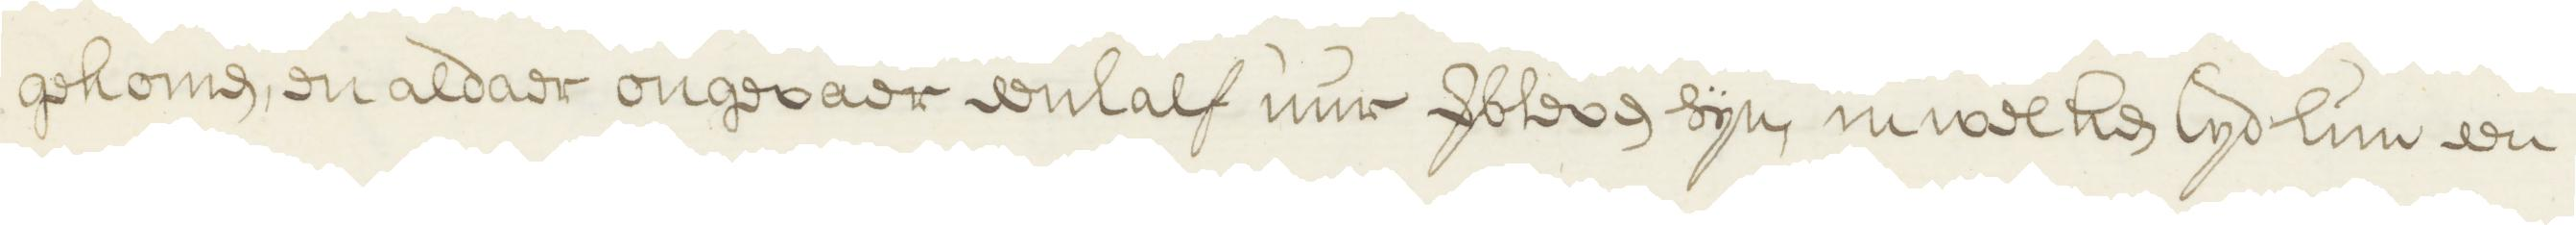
gekomen, en aldaer ongevaer een half uur verbleven sijn, in welken tyd hun een
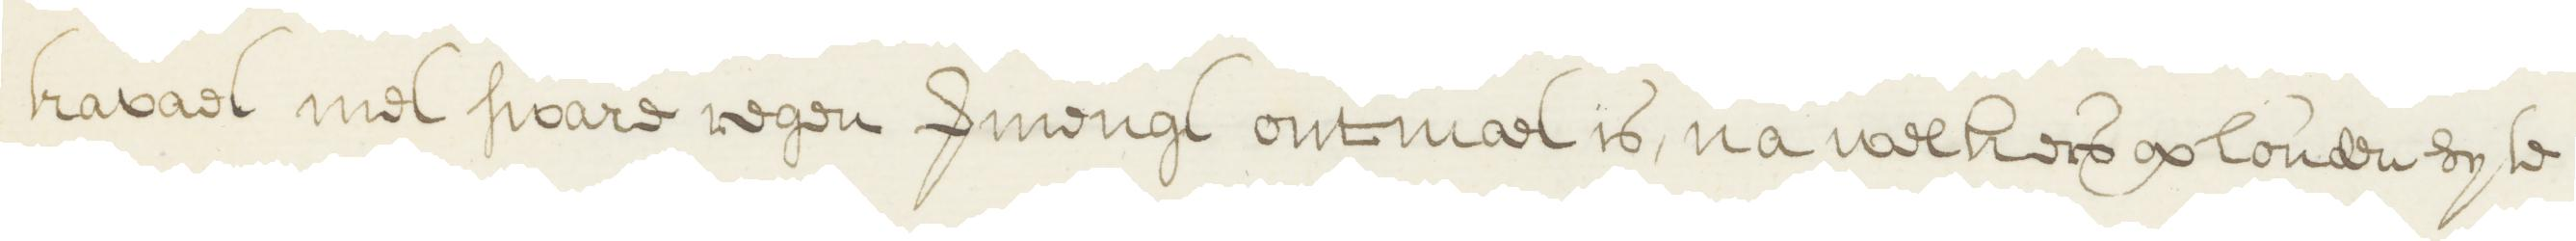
travaet met sware regen vermengt ontmoet is, na welkers ophouden sy te
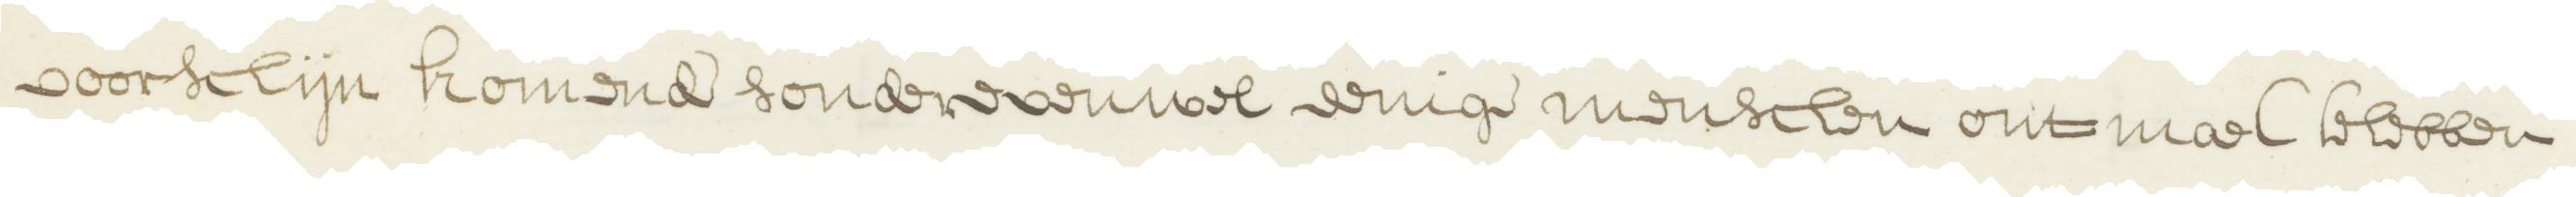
voorschijn komende sonder evenwel eenige menschen ontmoet te hebben
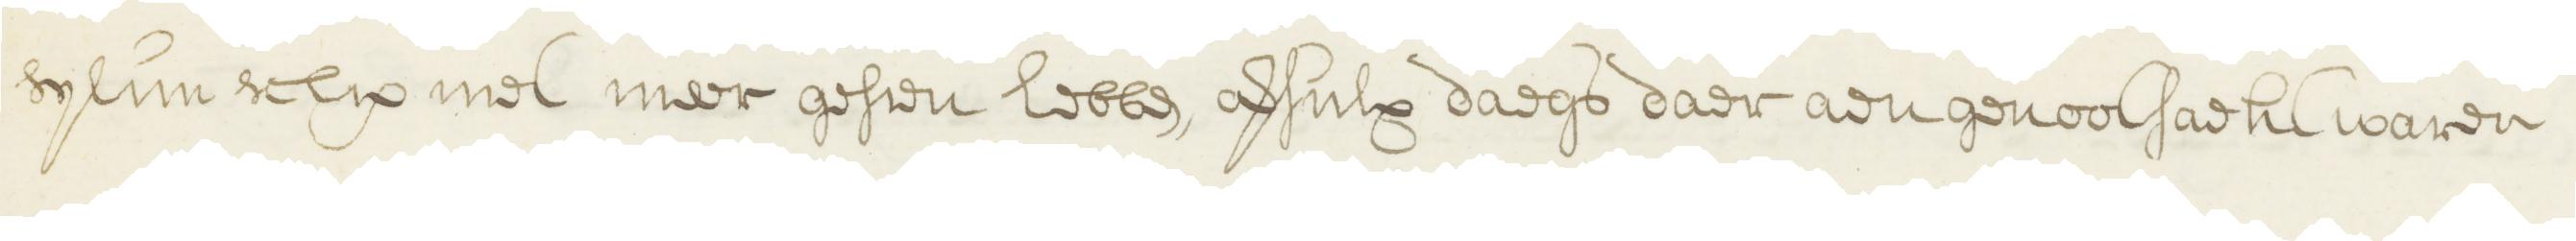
sy hun schip niet meer gesien hebben, oversulx daegs daer aen genootsaekt waren
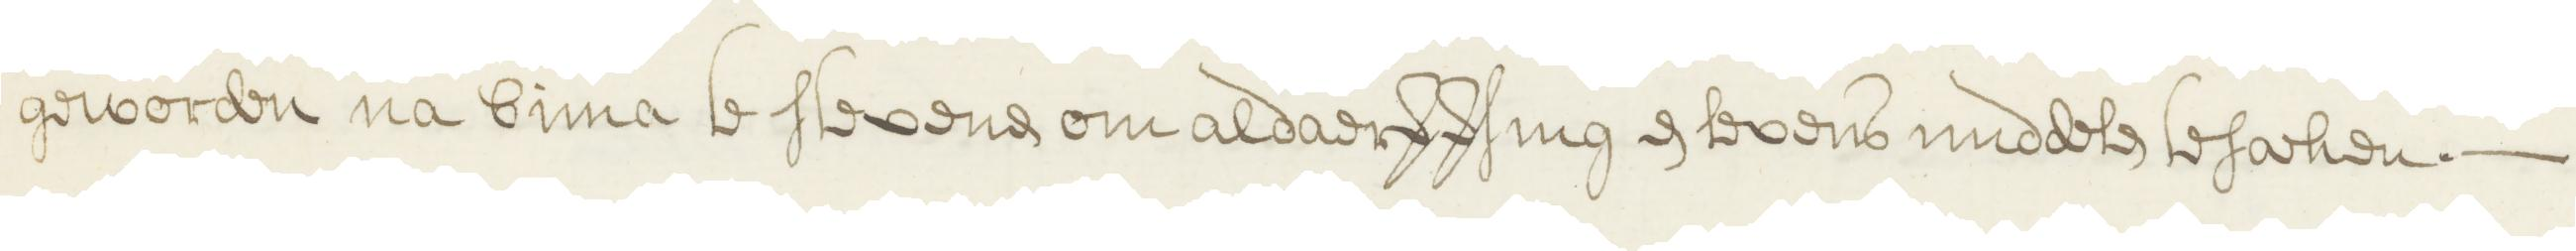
geworden na bima te stevenen om aldaer verversing en levens middelen te soeken. —
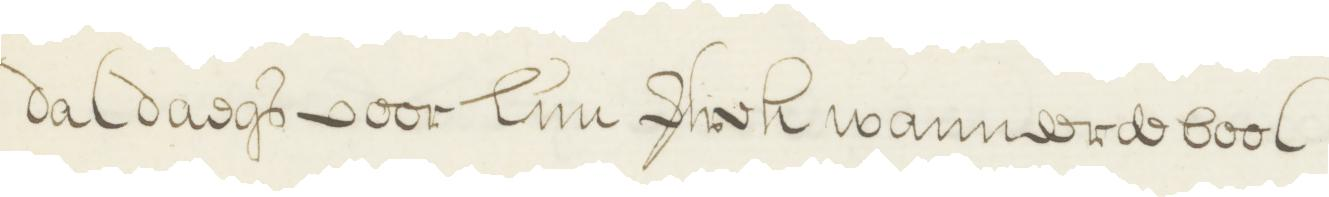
dat daegs voor hun vertrek wanneer de boot
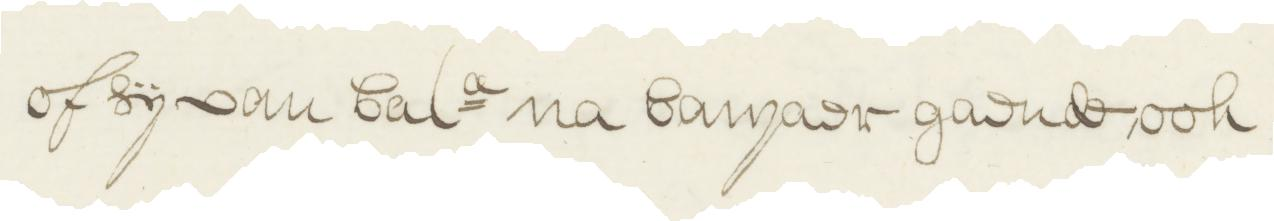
of sij van bat=a na banjaer gaende, ook
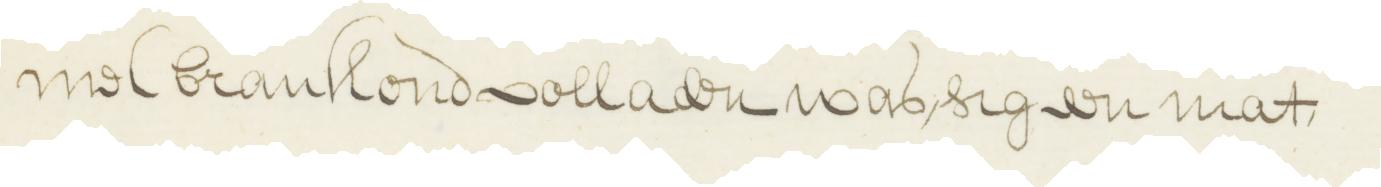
met branthond volladen was, sig een mat,
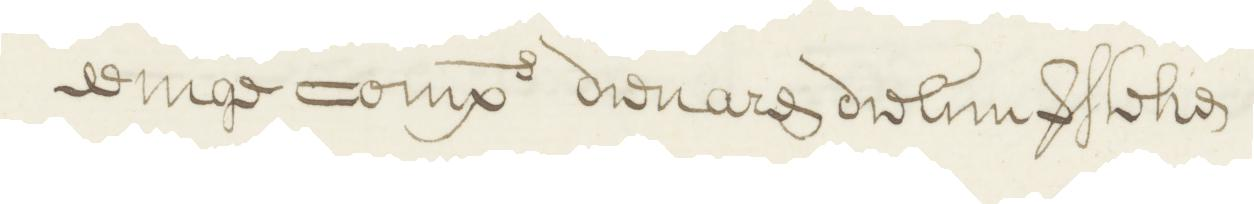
eenige comps dienaren die hun versteken
